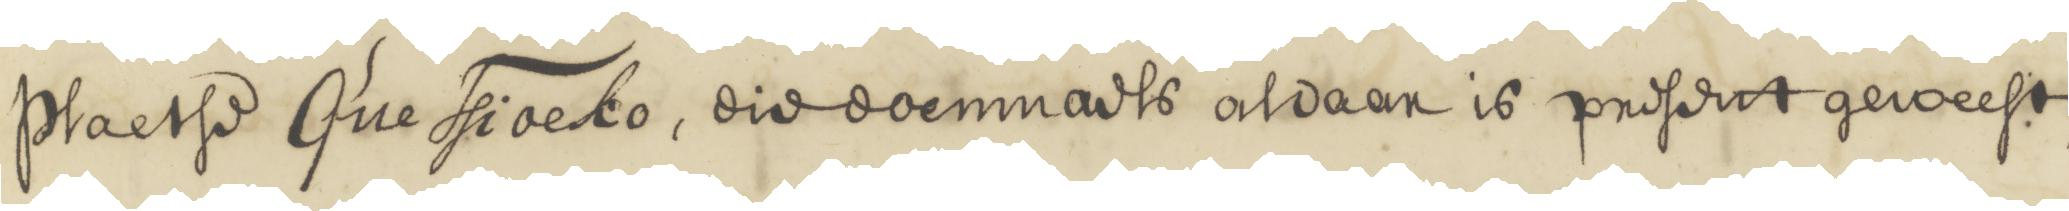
plaetse que Tsioeko, die doenmaels aldaar is present geweest
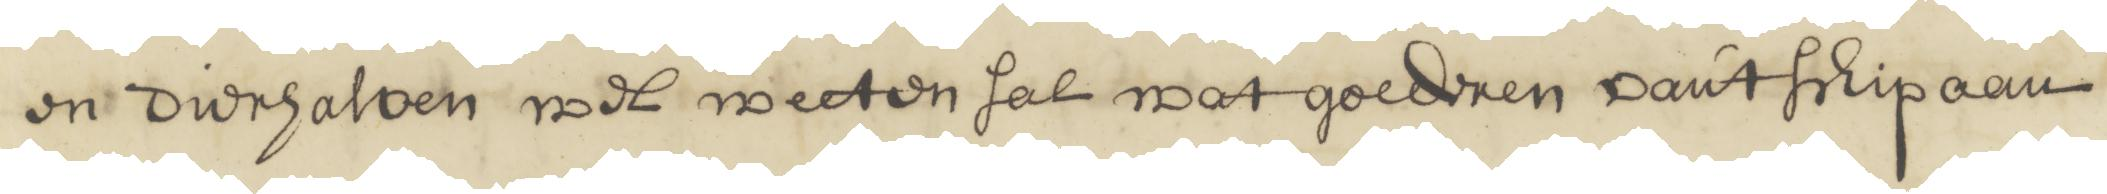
en dierhalven wel weeten sal wat goederen van’t schip aan
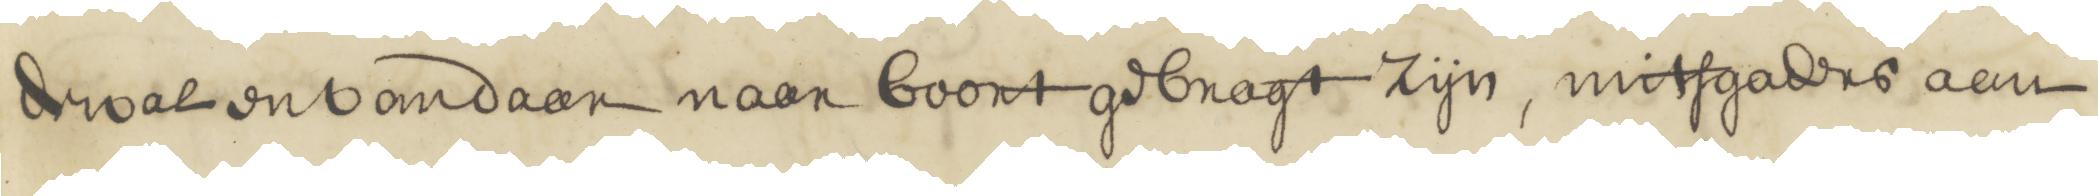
de wal en van daar naar boort gebragt zijn, mitsgaders aan
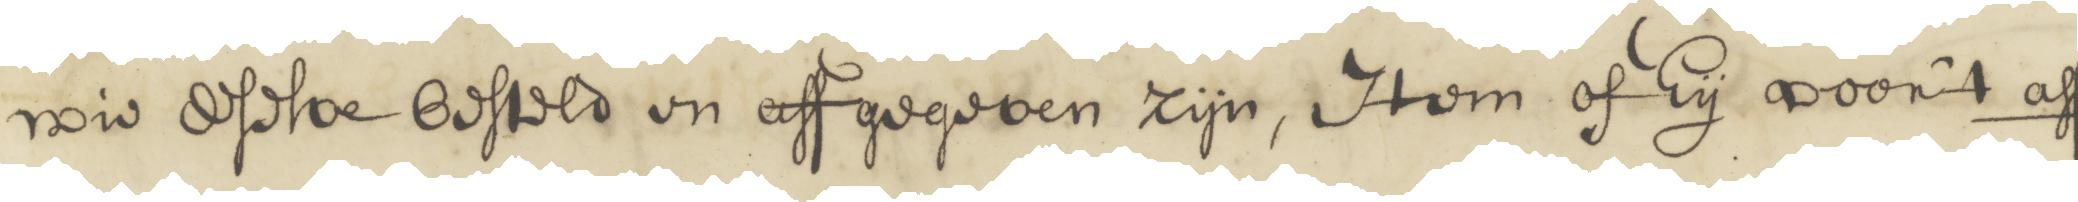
wie deselve besteld en affgegeven zijn, Jtem of hij voor’t aff
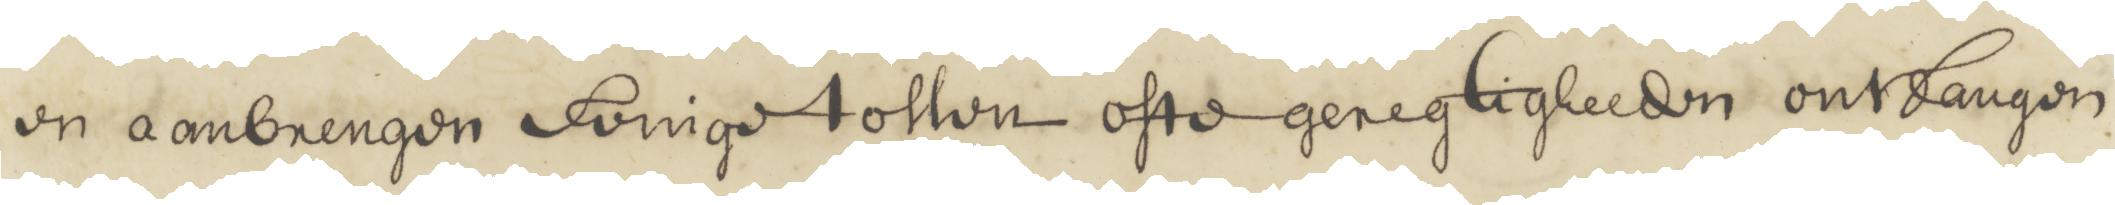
en aanbrengen Eenige tollen ofte geregtigheeden ontfangen
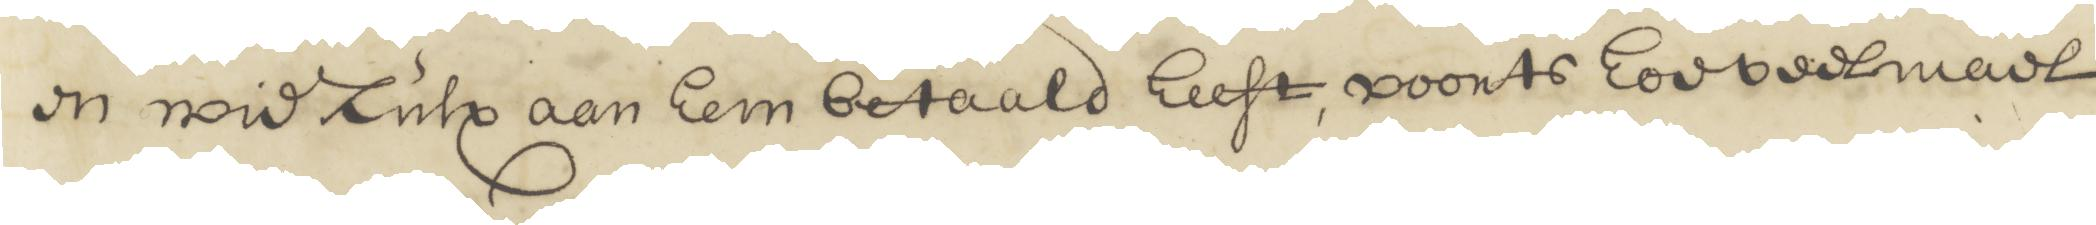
en wie zulx aan hem betaald heeft, voorts hoeveelmael
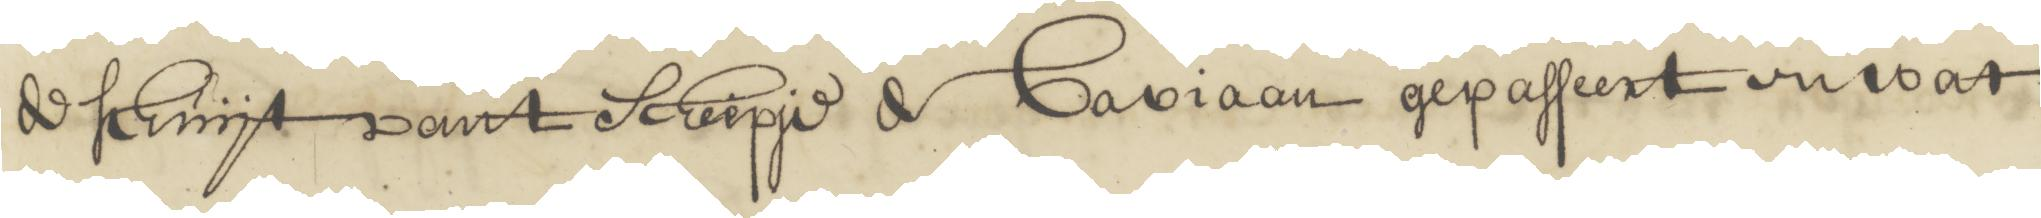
de schuijt vant scheepje de baviaan gepasseert en wat
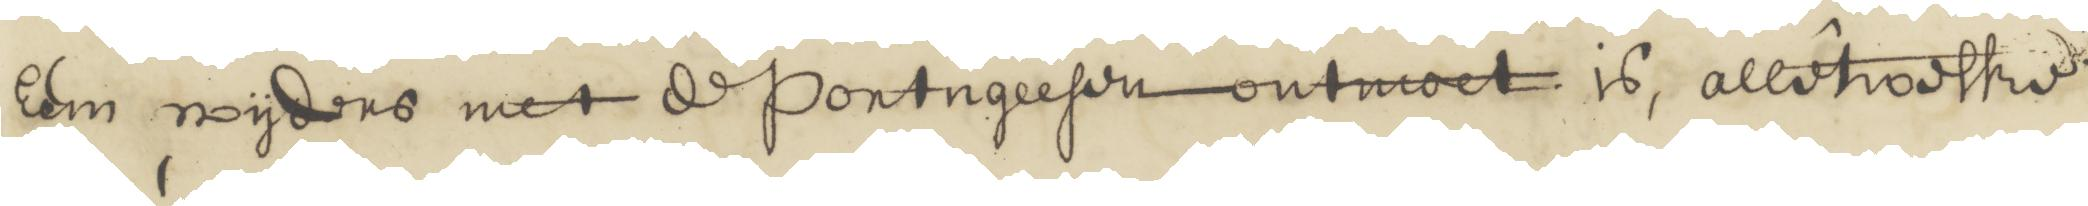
hem wijders met de portugeesen ontmoet is, alle 'twelke
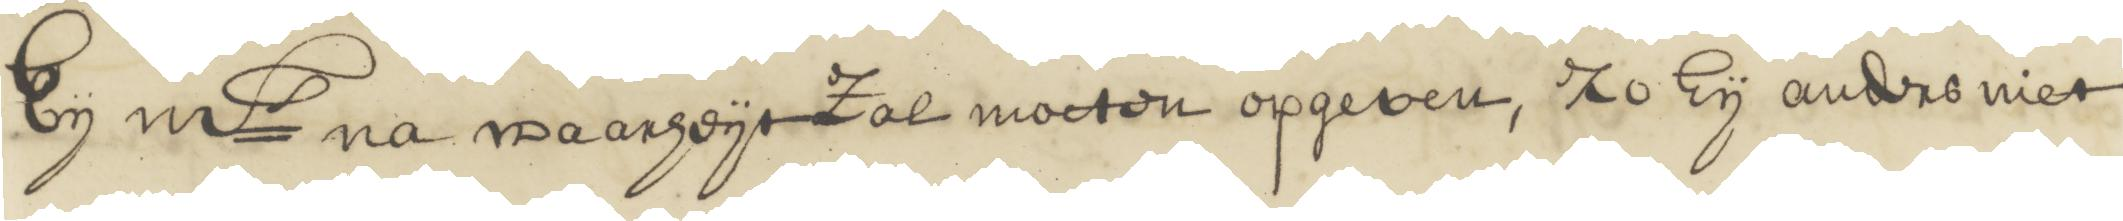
hij uE=s na waarheijt zal moeten opgeven, zo hij anders niet
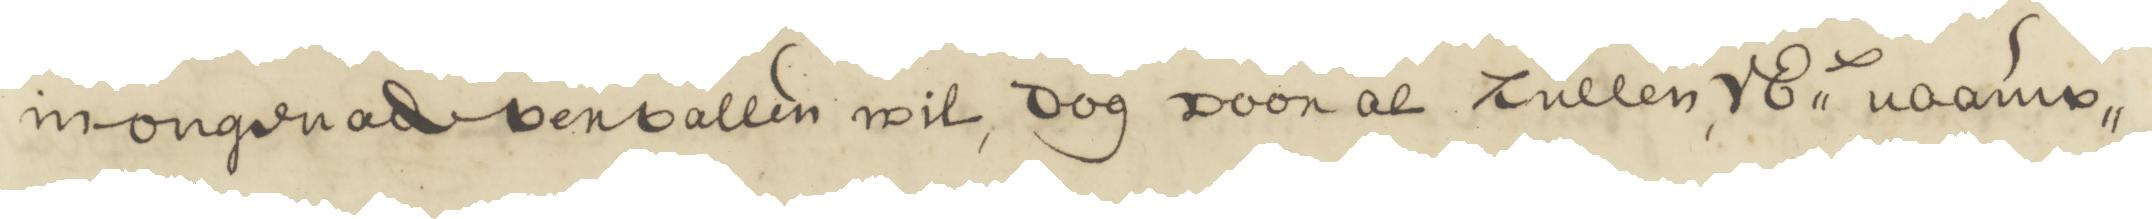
in ongenade vervallen wil, dog voor al zullen, VE„s naauw„
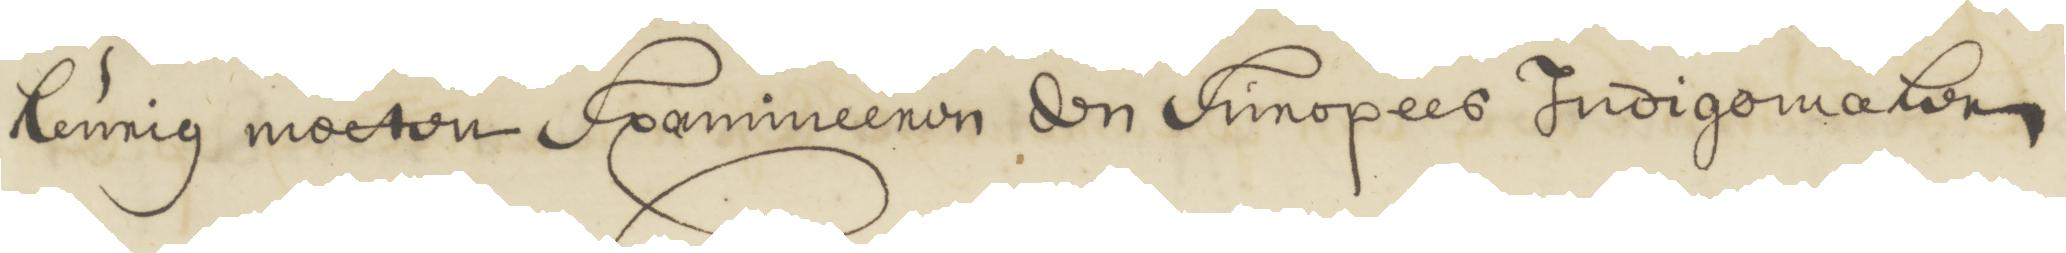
keurig moeten Examineeren den Europees Jndigomaker
